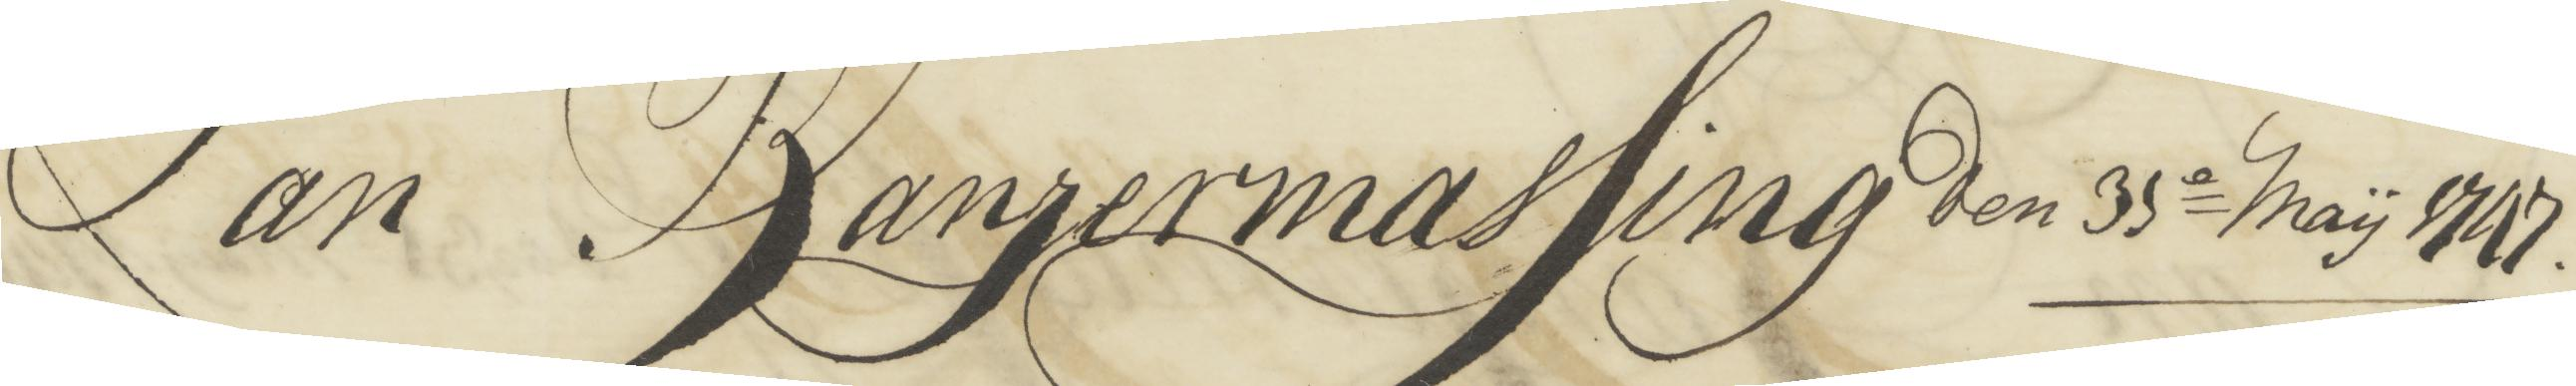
Van Banjermassing den 31=e Maij 1747.
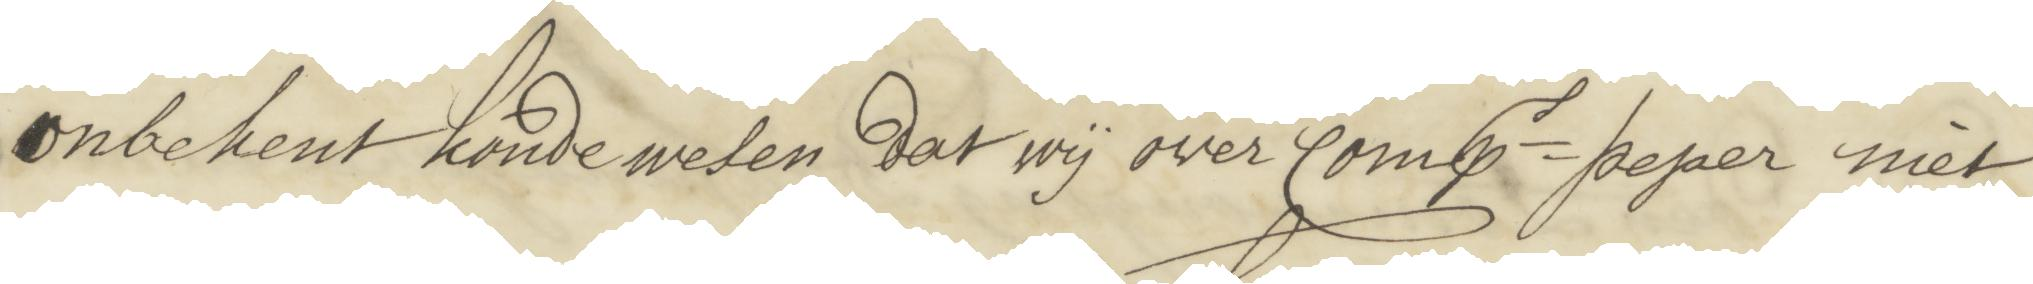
onbekent konde wesen dat wij over Comp=s peper niet
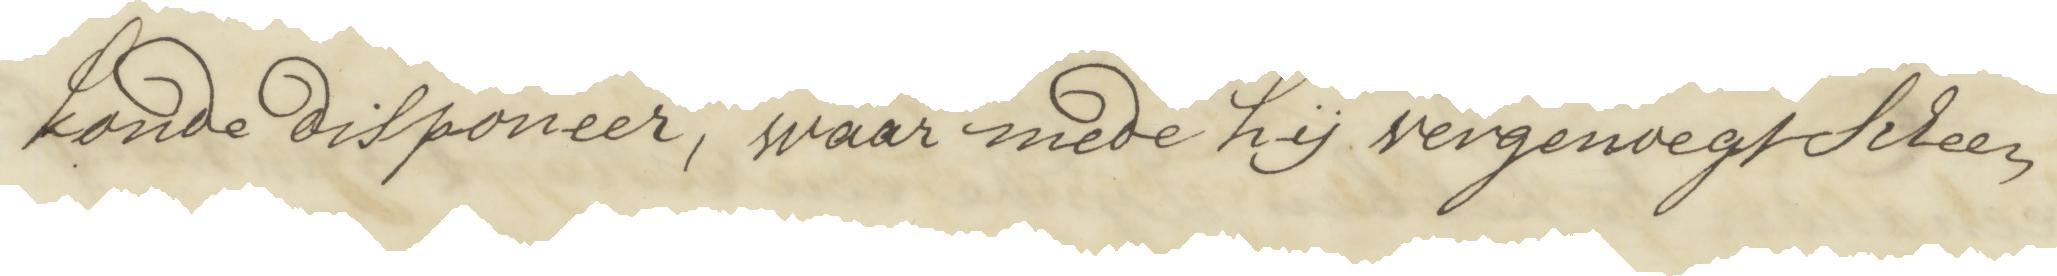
konde disponeer, waar mede hij vergenoegt scheen
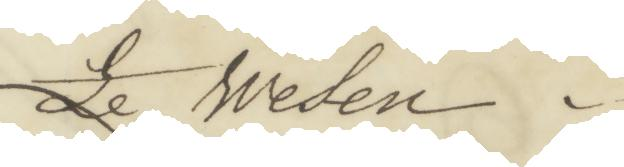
te wesen —
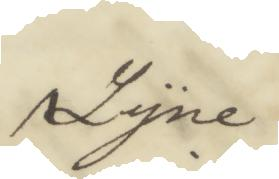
^zijne
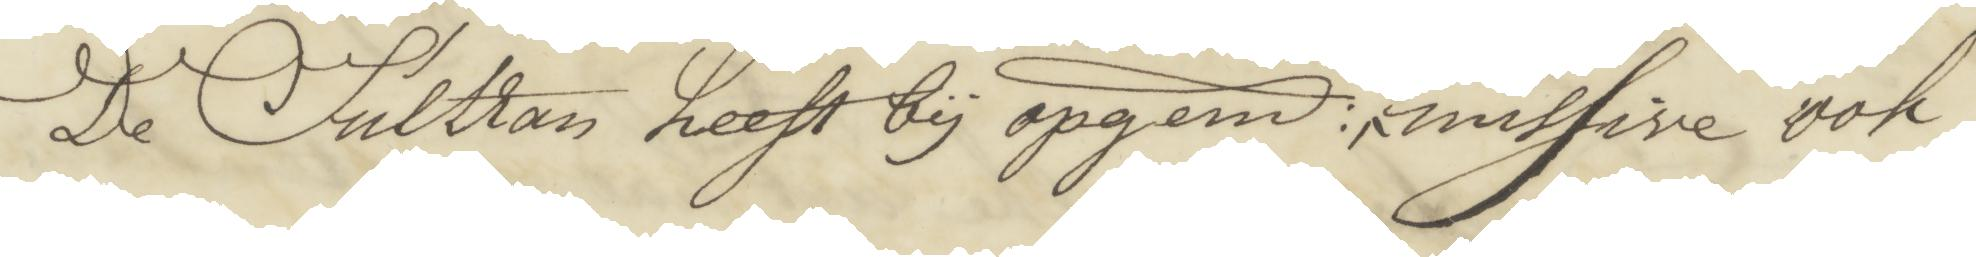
De Sulthan heeft bij opgem: ^ missive ook
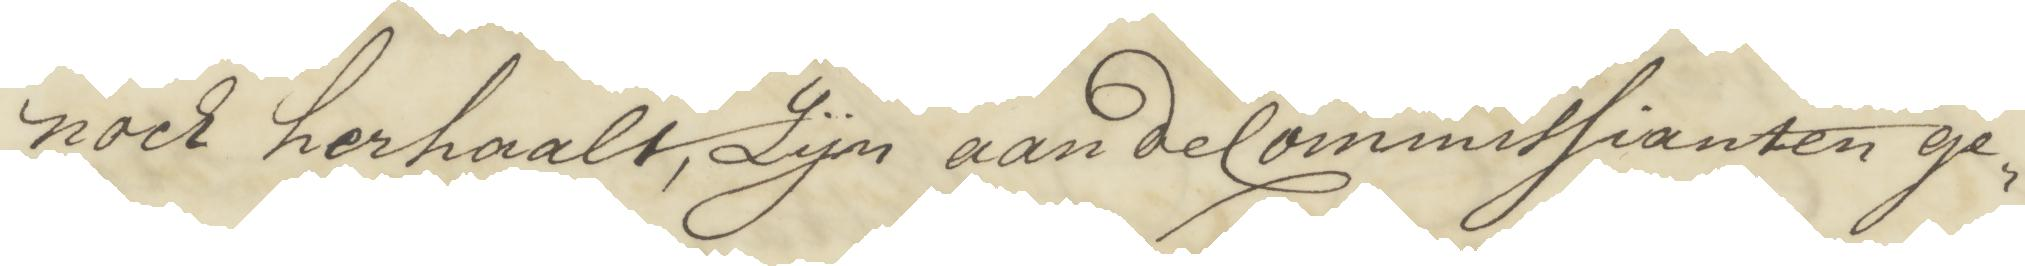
noch herhaalt, zijn aan de Commissianten ge„
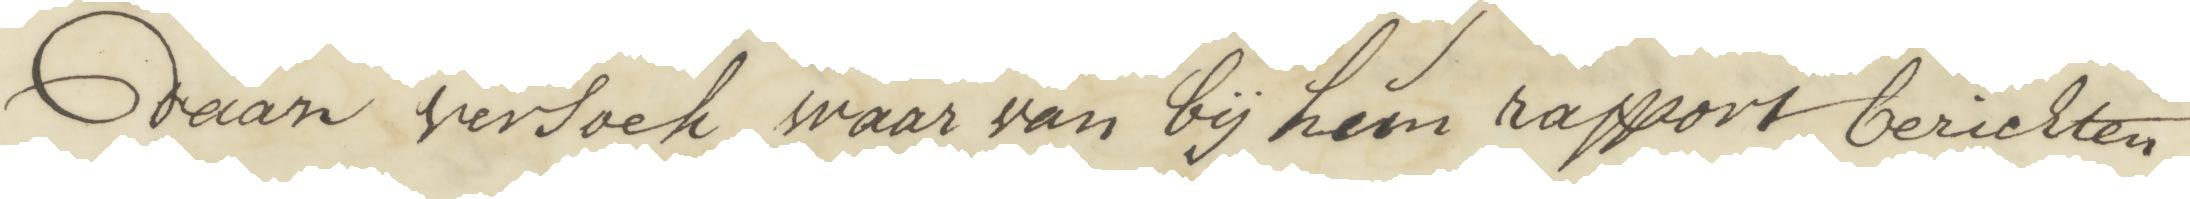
daan versoek, waar van bij hem rapport berichten
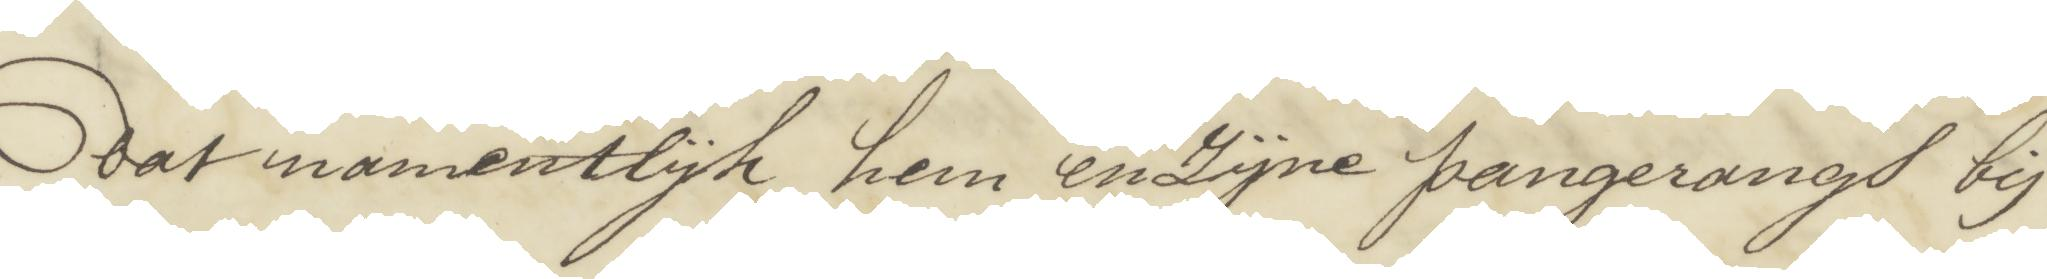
dat namentlijk hem en zijne pangerangs bij
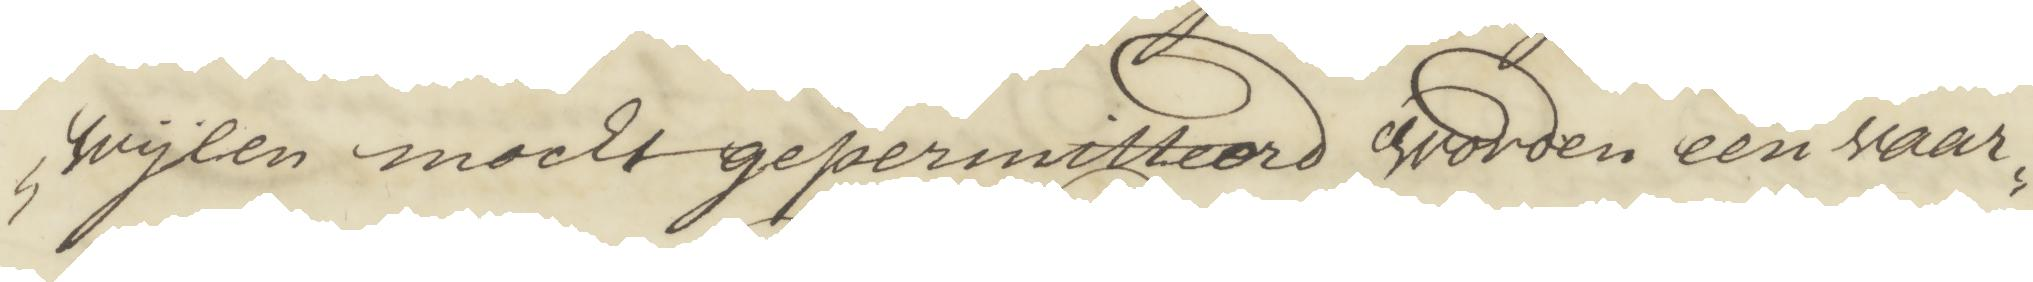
„wijlen mocht gepermitteerd worden een vaar
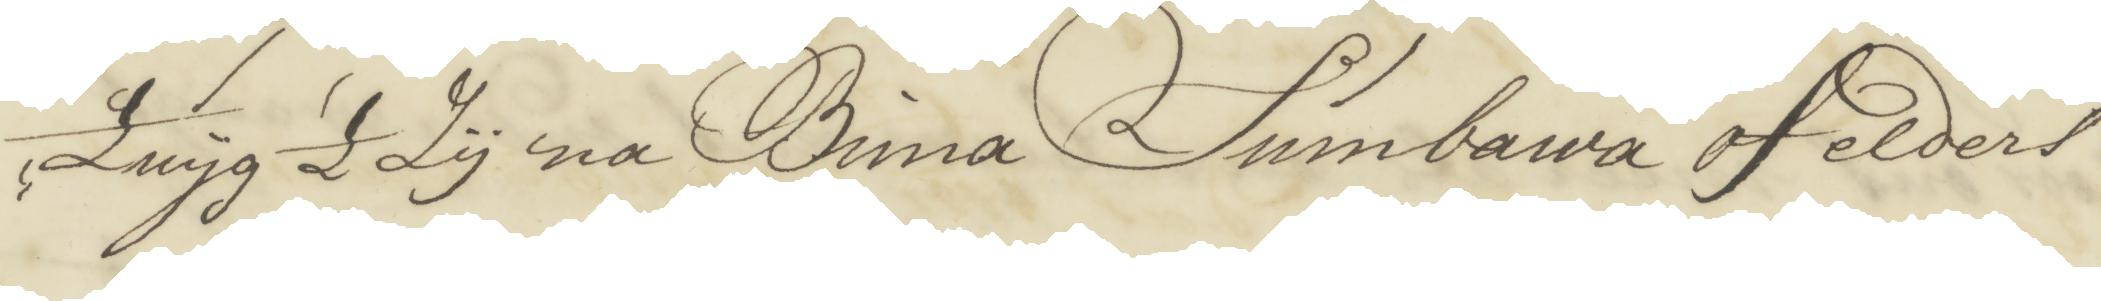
„tuijg 't zij na Bima Sumbawa of elders
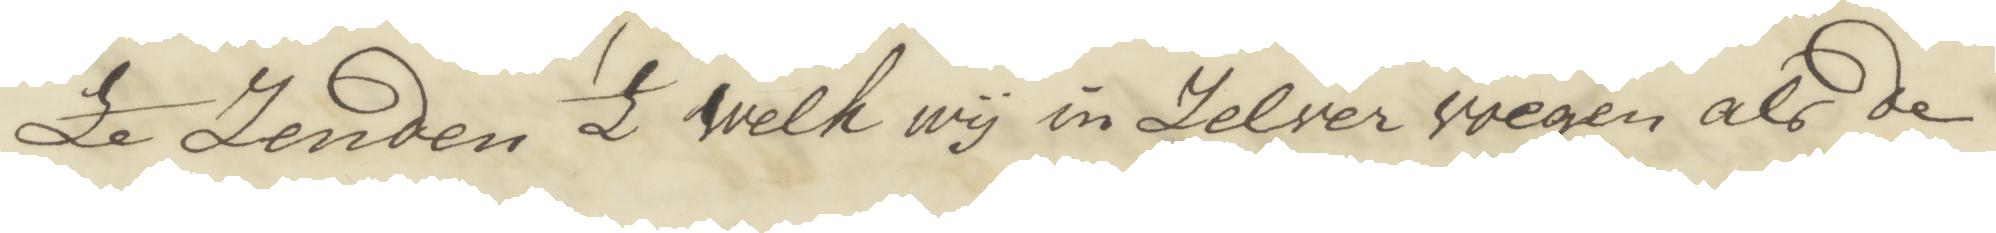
te zenden 't welk wij in zelver voegen als de
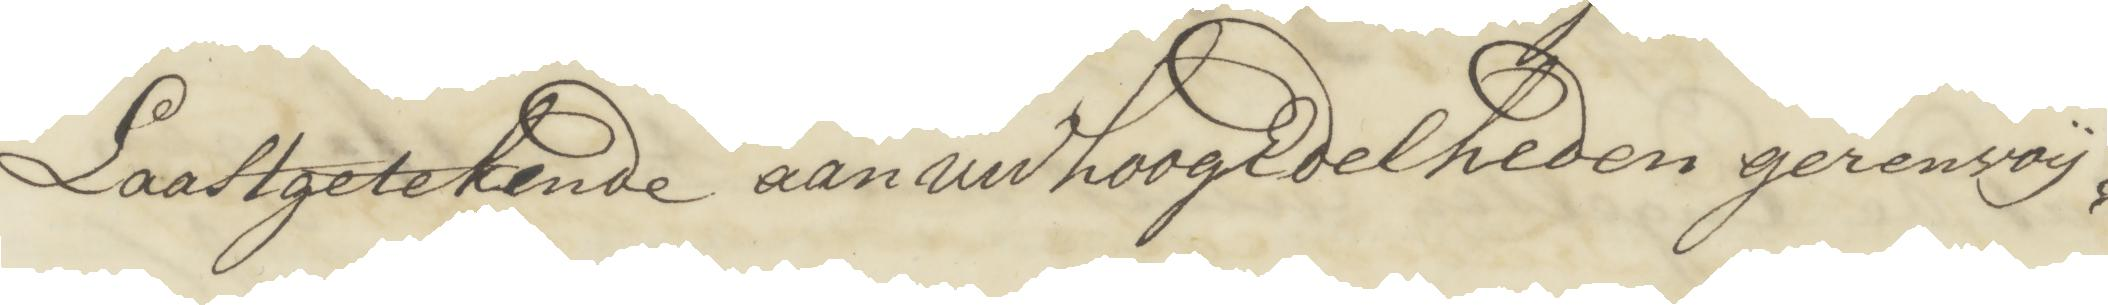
Laastgetekende aan uw hoog Edelheden gerenvoij
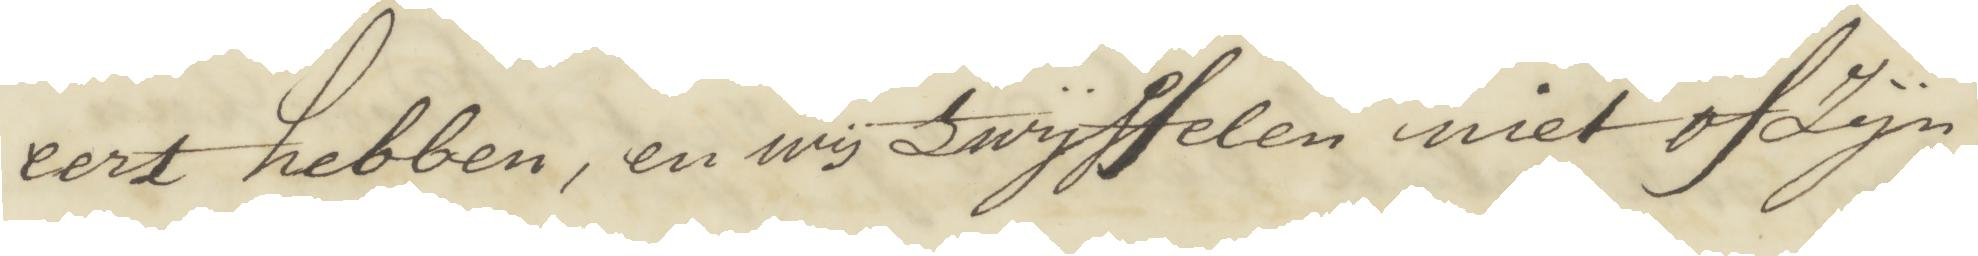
eert hebben, en wij twijffelen niet of zijn
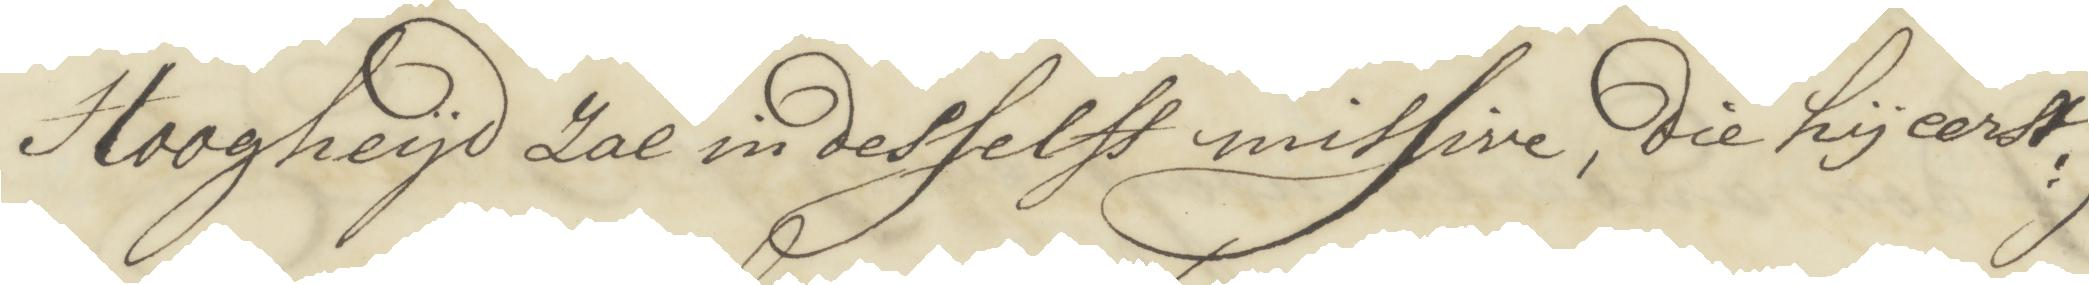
Hoogheijd zal in desselfs missive, die hij eerst„
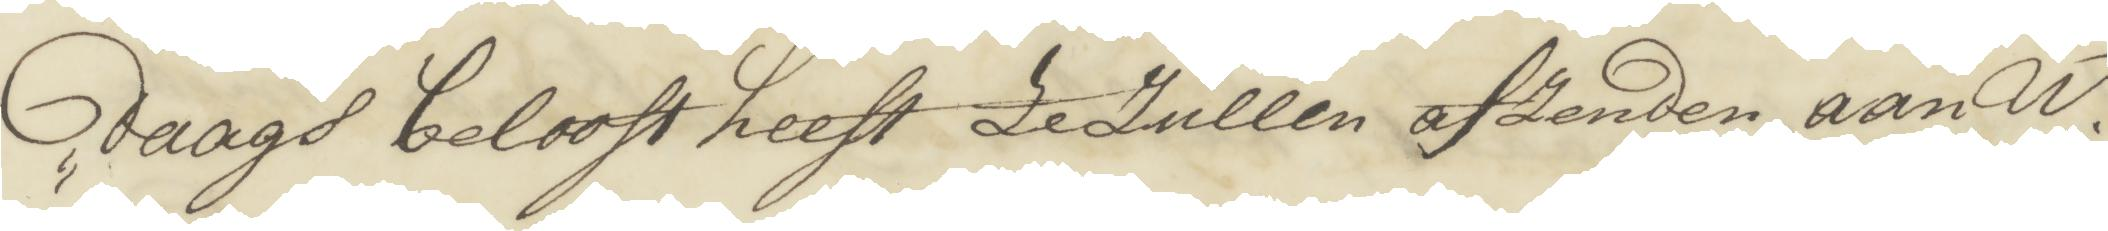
„daags belooft heeft te zullen afzenden aan U
